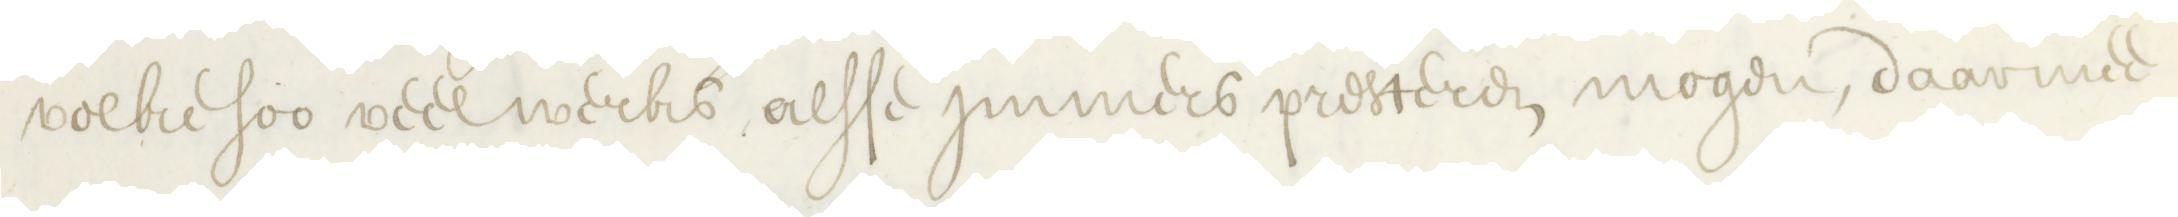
volke soo veel werks, alsse jmmers presteren mogen, daarmee
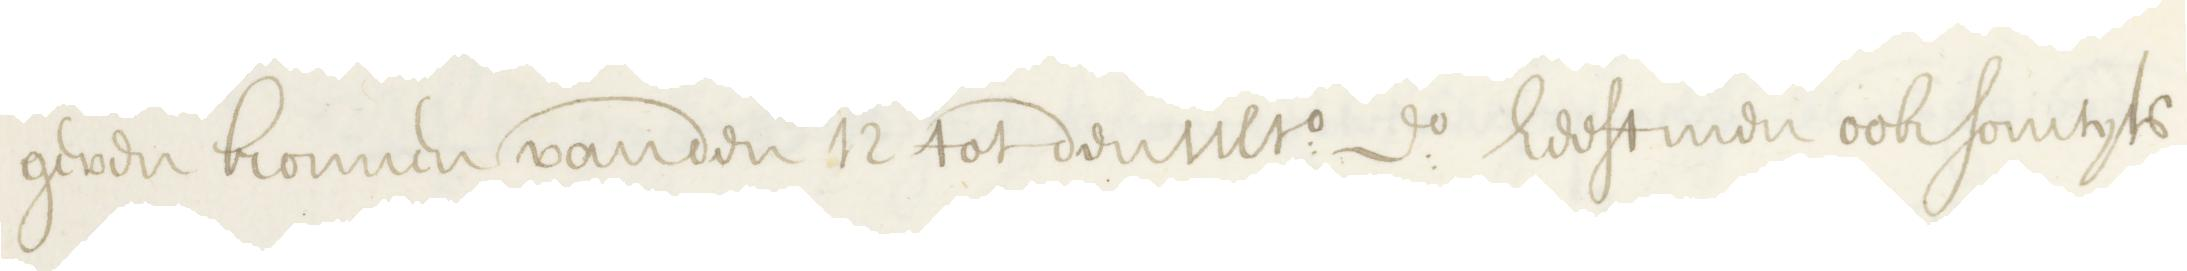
geven konnen van den 12 tot denult:o d:o Heeft men ook somtyts
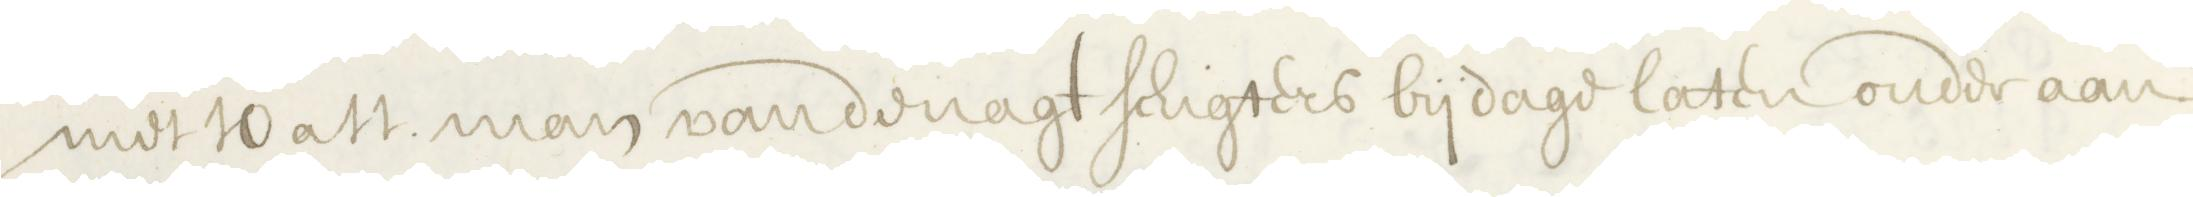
met 10 a11. man van de nagt schigters bij dage laten onder aan
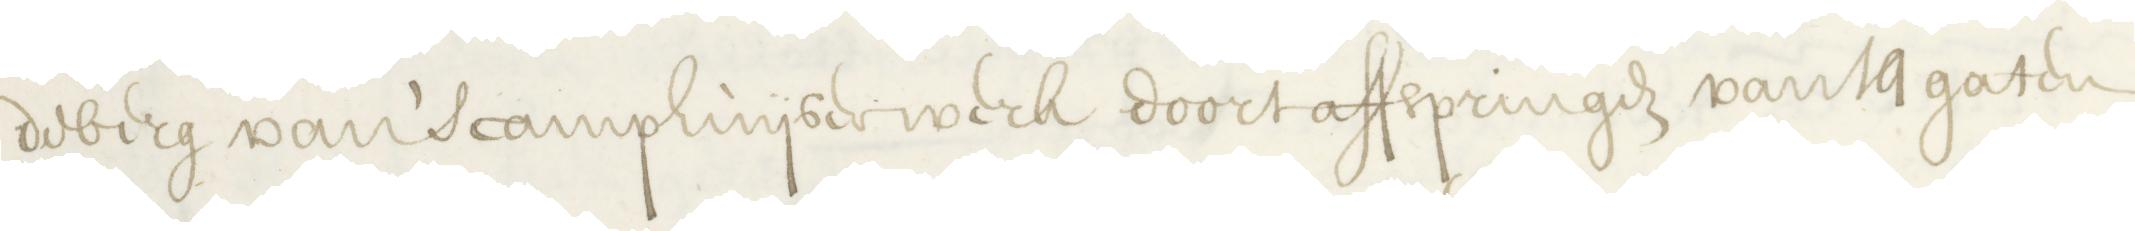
deberg van 's camphuijser werk doort affspringen van 14 gaten
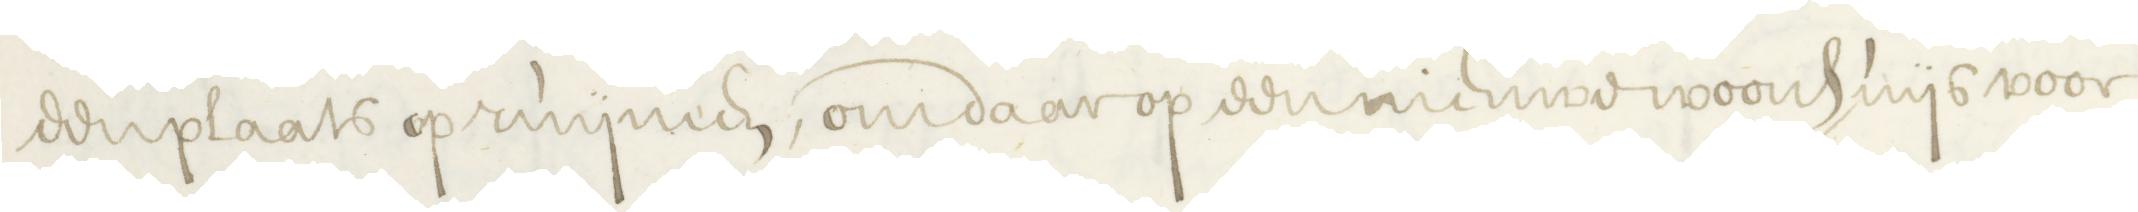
een plaats op ruijmen, om daar op een nieuwe woonhuijs voor
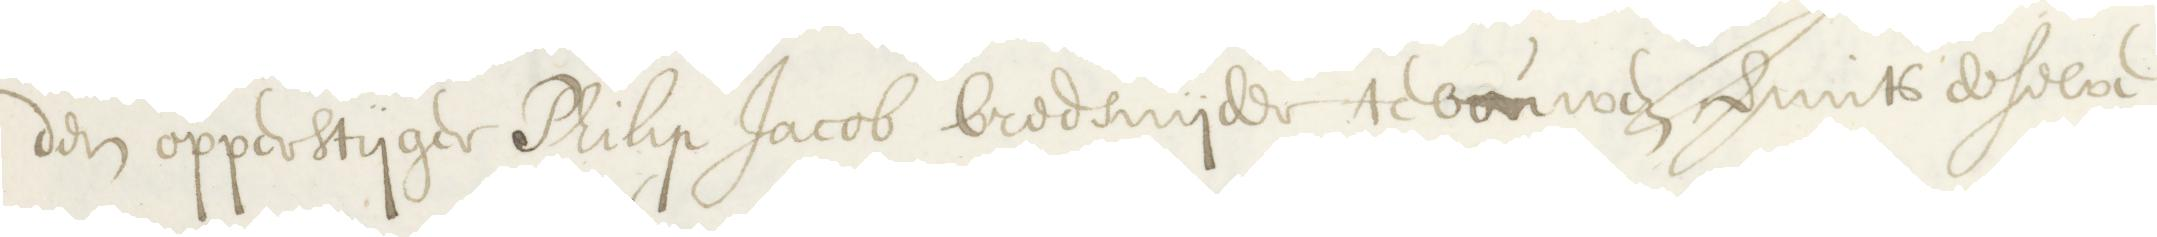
den opperstijger Philip Jacob bredsnijder te bouwen vermits deselve
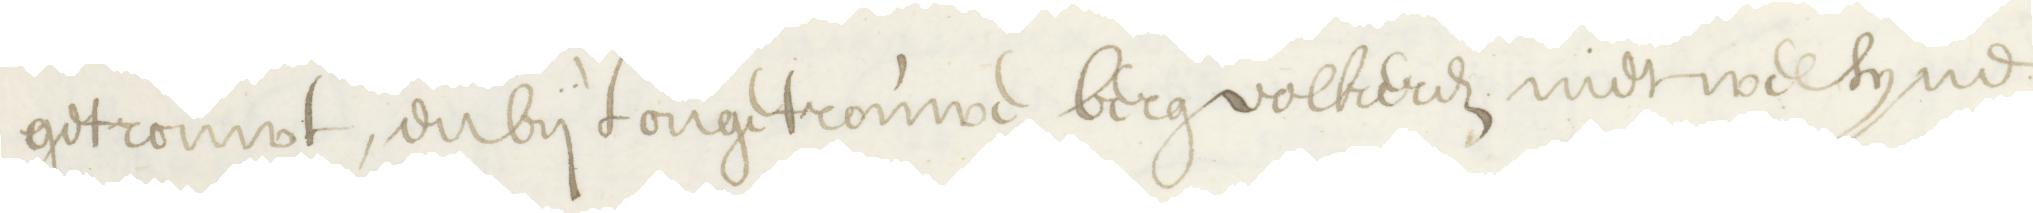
getrouwt, en bij ’t ongetrouwe berg volkeren niet wel syne
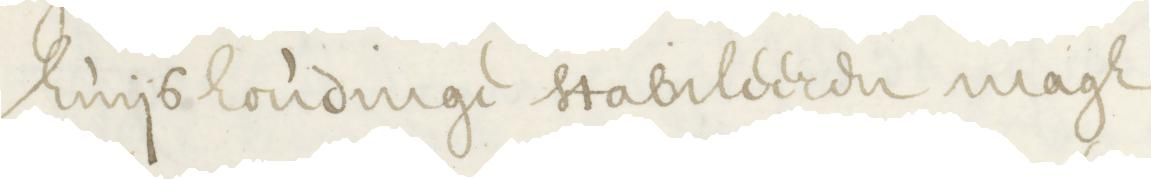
huijshoudinge stabileeren magh
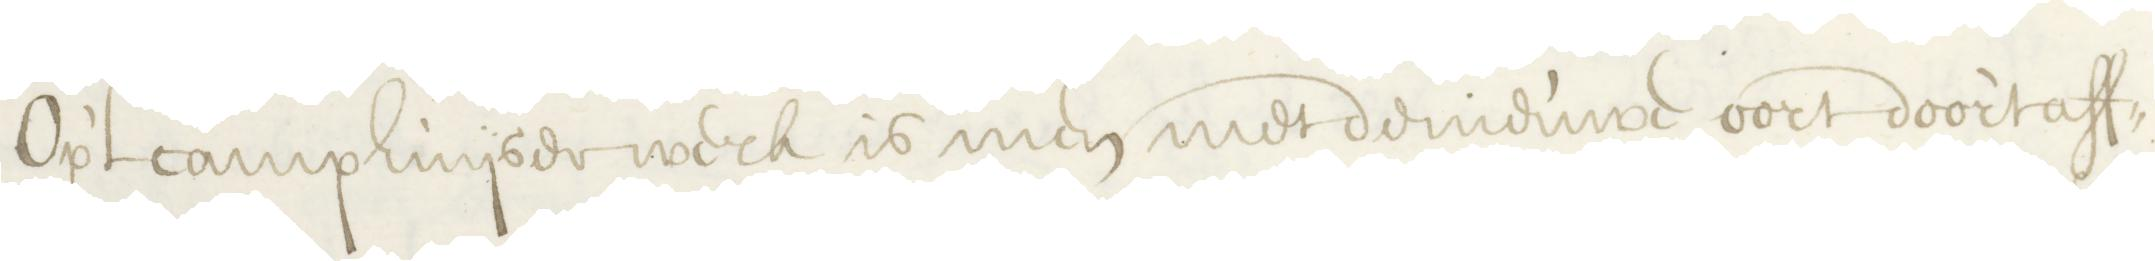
Op’t camphuijser werk is men met denieuwe oort door’t aff„
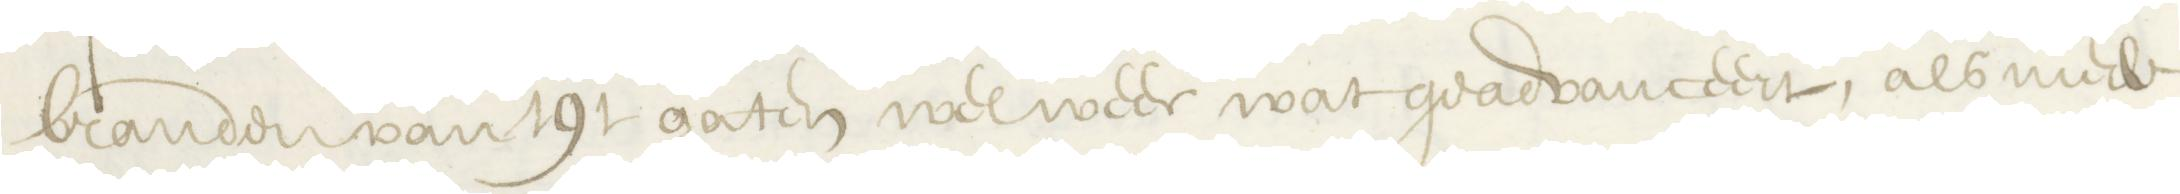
branden van 191 gaten welweer wat geadvanceert, als mede
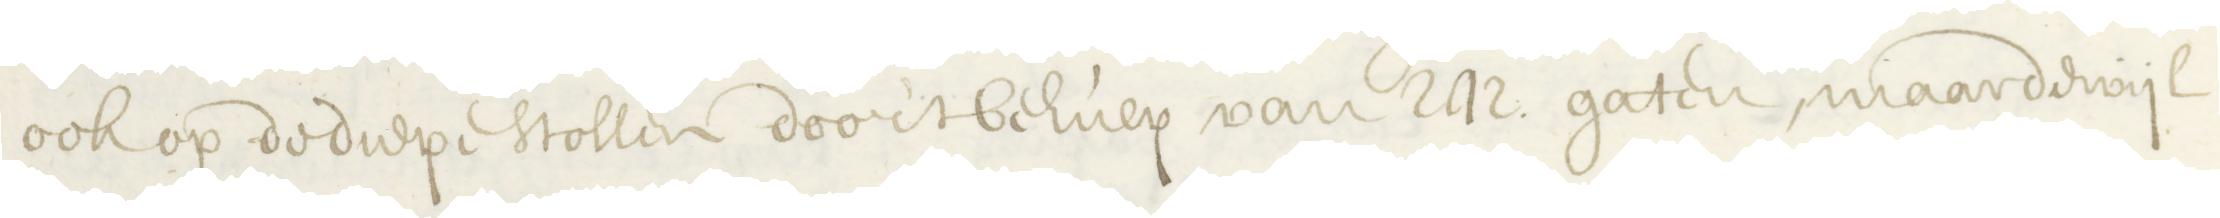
ook op de diepe stollen door ’t behulp van 242: gaten, maar dewijl
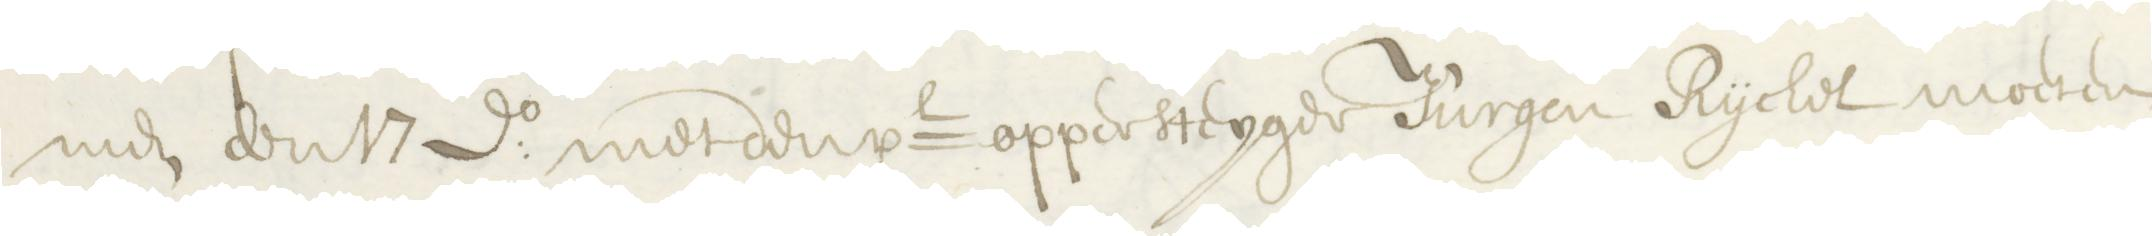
men den 17 d:o met denp=l oppersteyger Iurgen Rijchel moeten
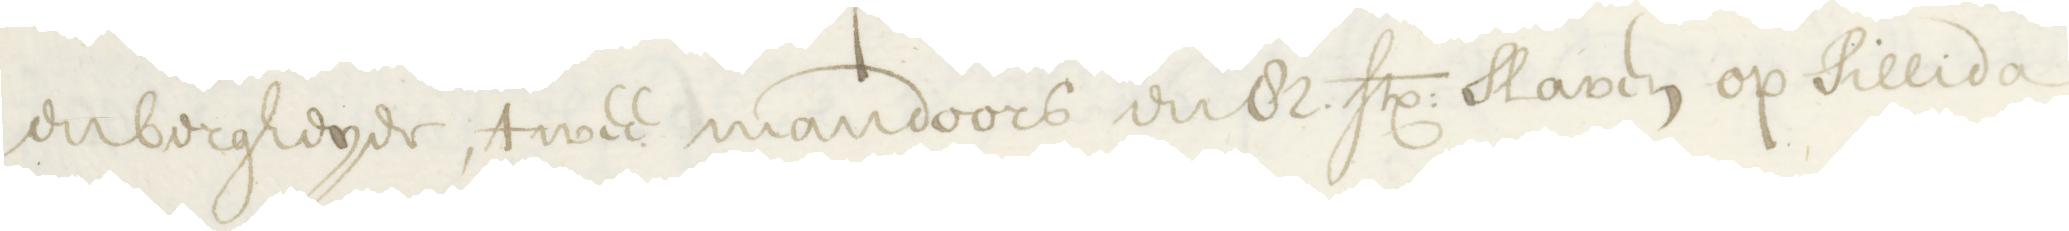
enbergheyer, 'twee mandoors en 82 stx: slaven op Sillida
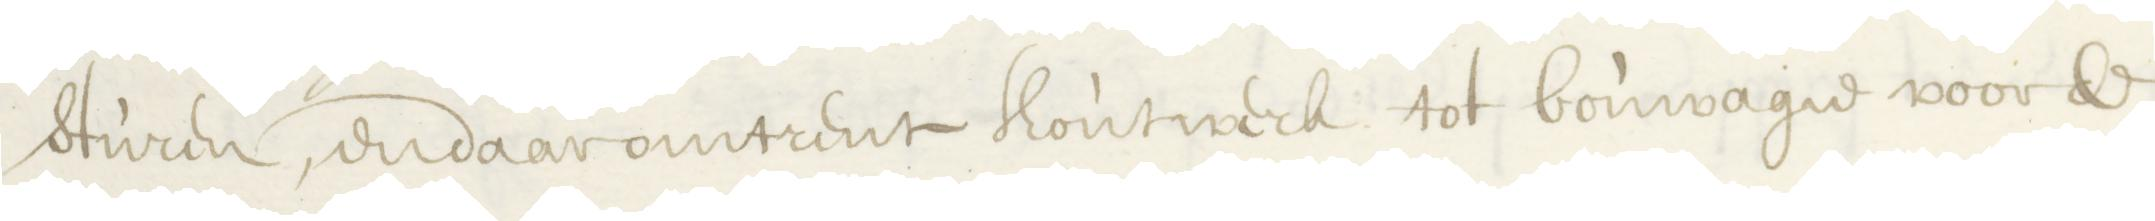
sturen, en daar omtrent thoutwerk tot bouwagie voor de
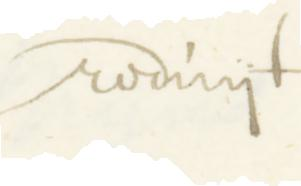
reduijt
